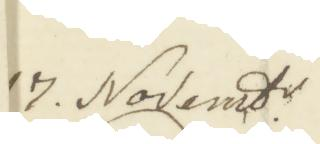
17. Novemb.r
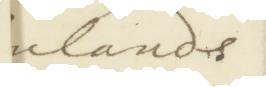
nlands
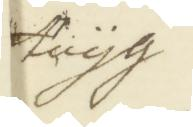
tuijg
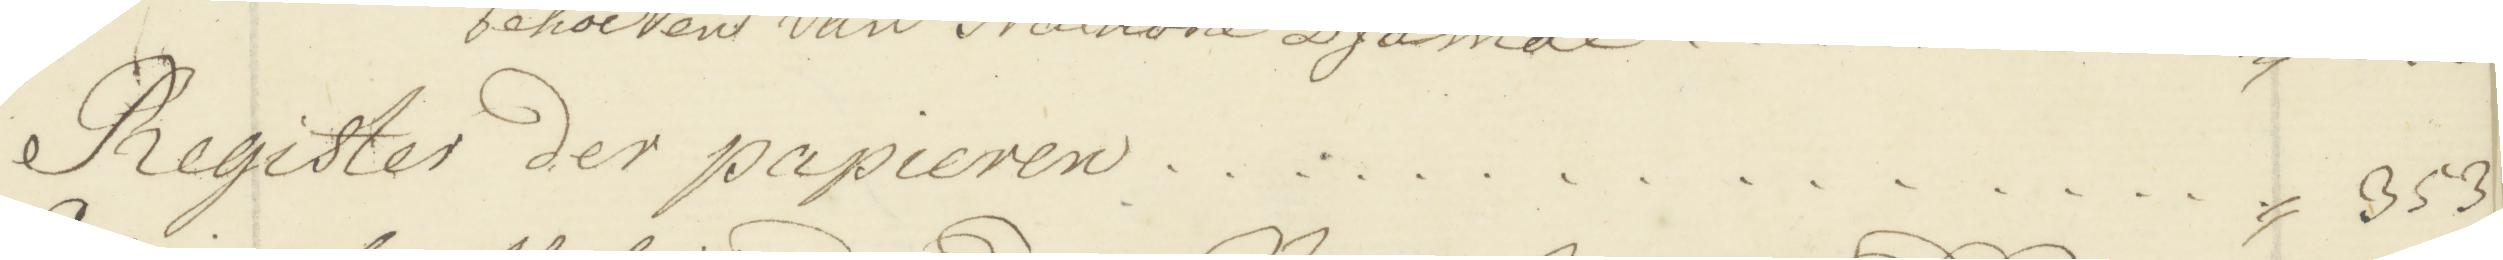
Register der papieren - - - - - - - - - - - - - - - - „ 353
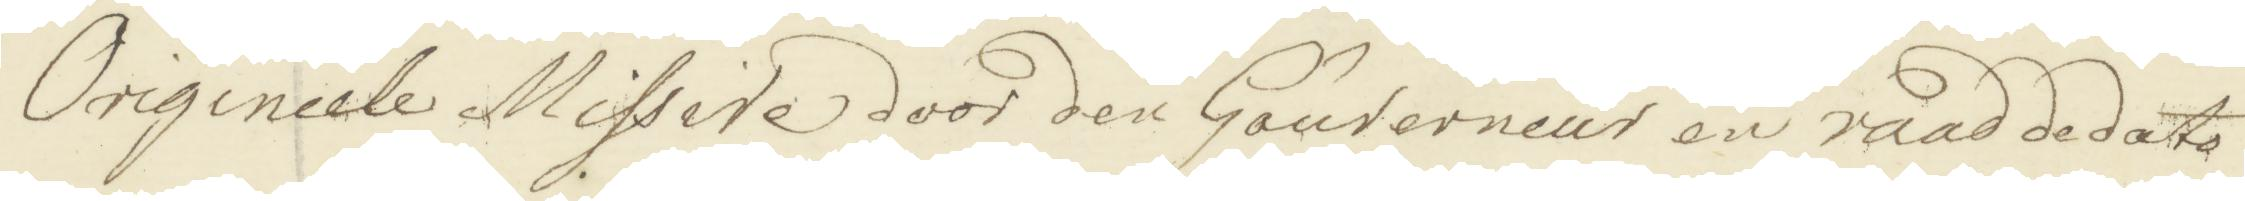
Origineele Missive door den Gouverneur en raad de dato
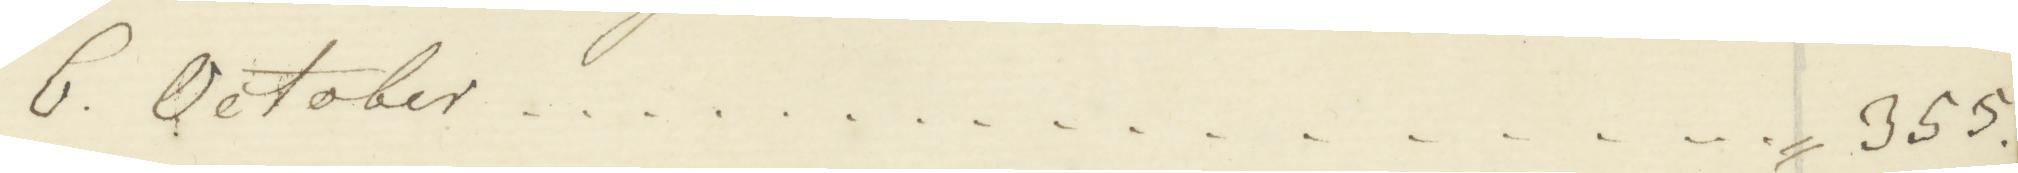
6. October - - - - - - - - - - - - - - - - - „ 355.
